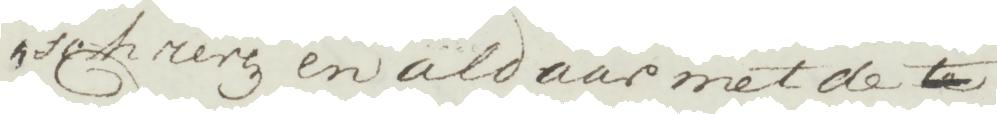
„schreven en aldaar met de te
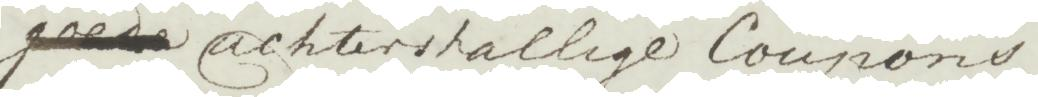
goede achterstallige Coupons
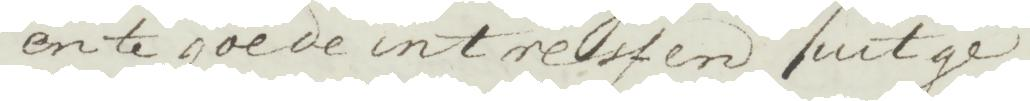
en te goede intressen uitge
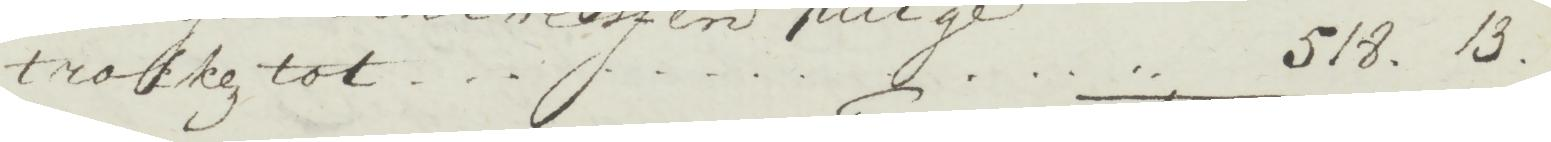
trokken tot - - - - - - - - - - - - - „ 518. 13.
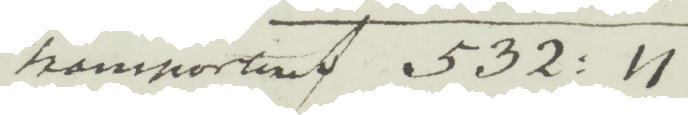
transportere ƒ 532: 11
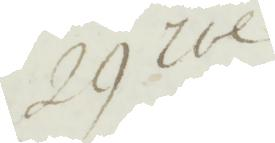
29 rol
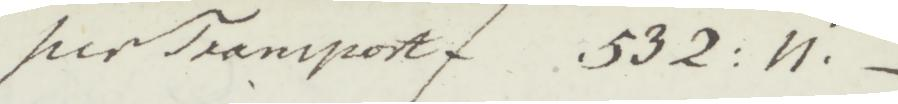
per Transport ƒ 532: 11. -
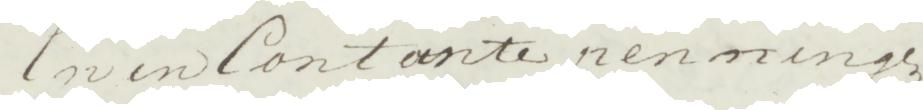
En in Contante penningen
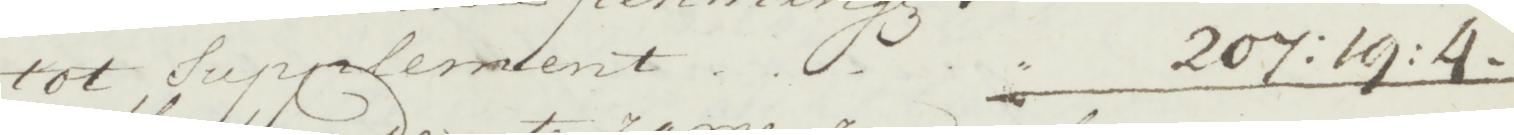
tot supplement - - - - „ 207:19: 4 -
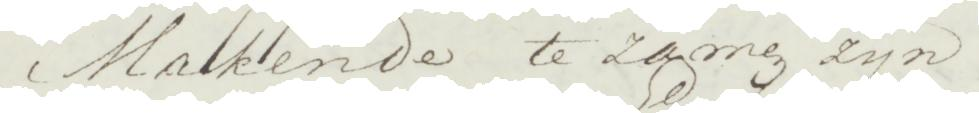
Makende te zamen zyn
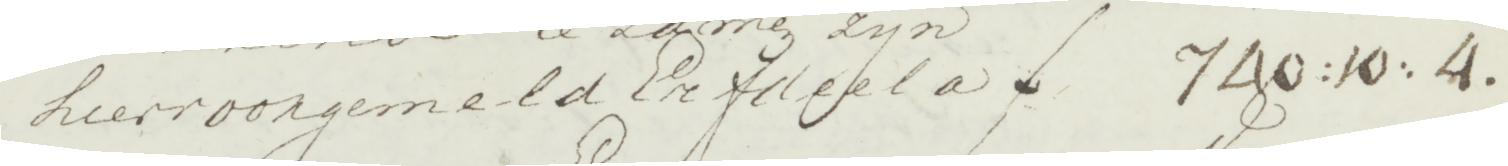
hiervoor gemeld Erfdeel a ƒ 740:10: 4.
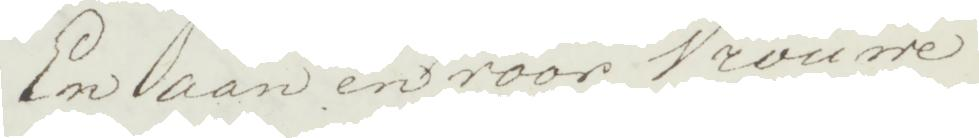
En aan en voor Vrouwe
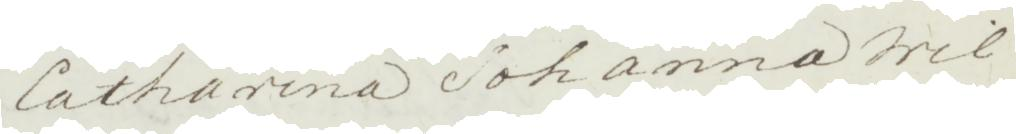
Catharina Johanna Wil
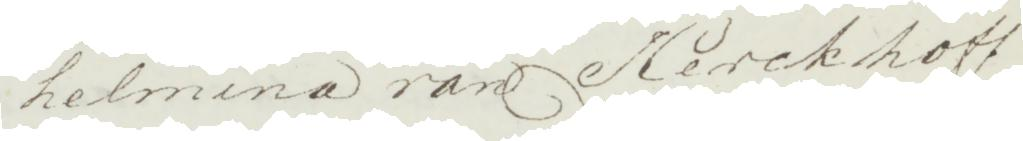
helmina van Kerckhoff
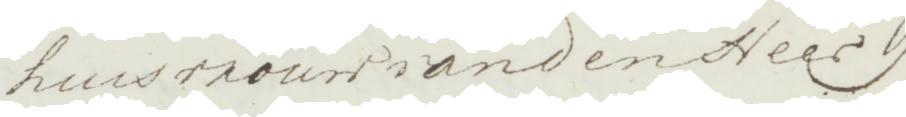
huisvrouw van den Heer
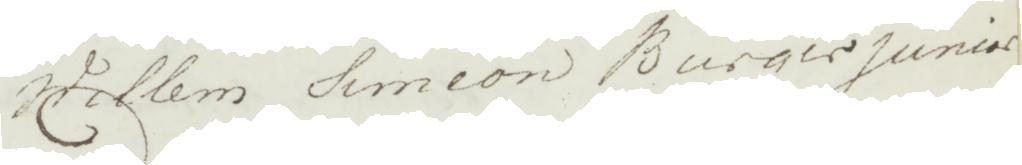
Willem Simeon Burger Junior
